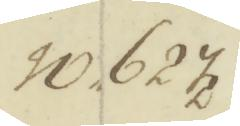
10„62½
